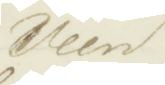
Veen
